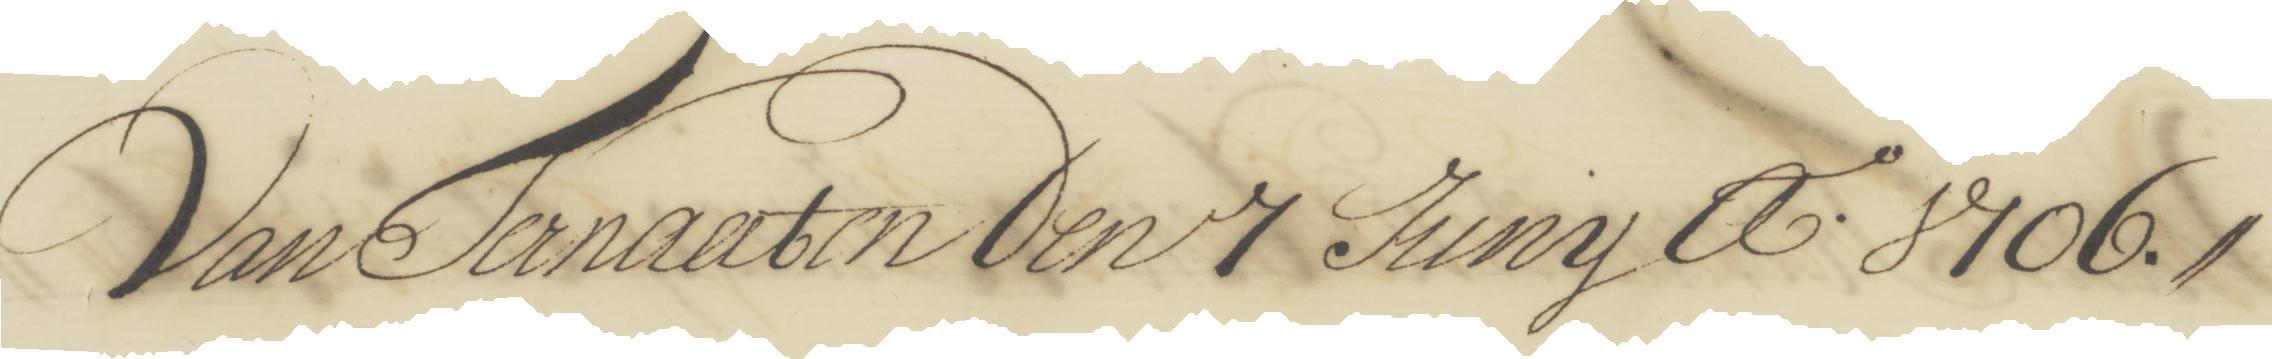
Van Ternaaten den 7 Iunij A.o 1706.„
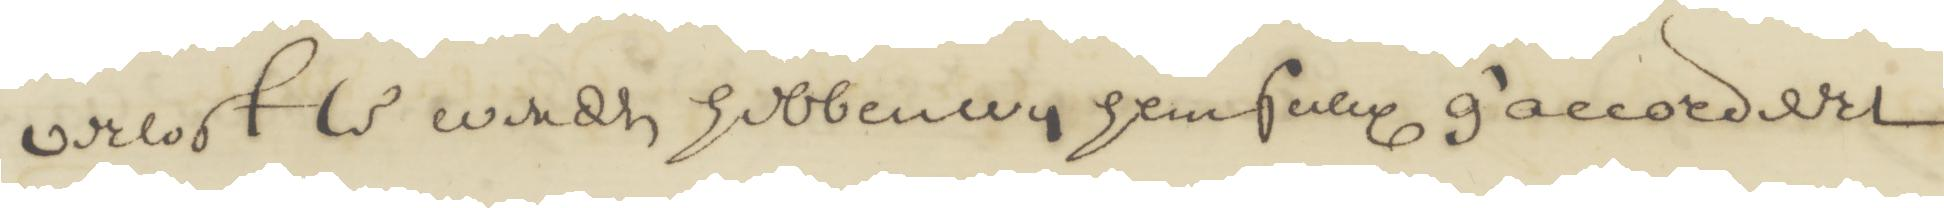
verlost te werden hebben wy hem sulx g’accordeert
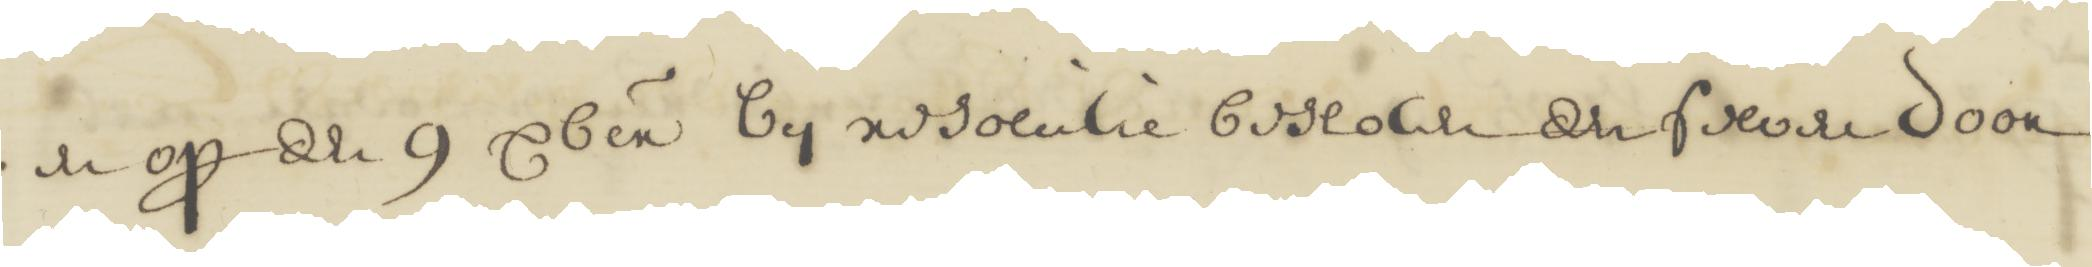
en op den 9 xber by resolutie besloten den selven door
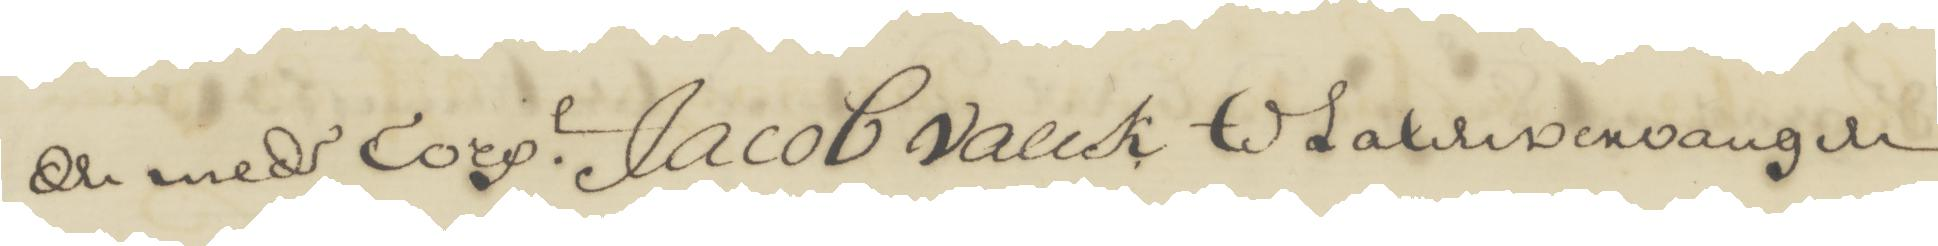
den mede Corp.l Jacob Vaeck te laten vervangen
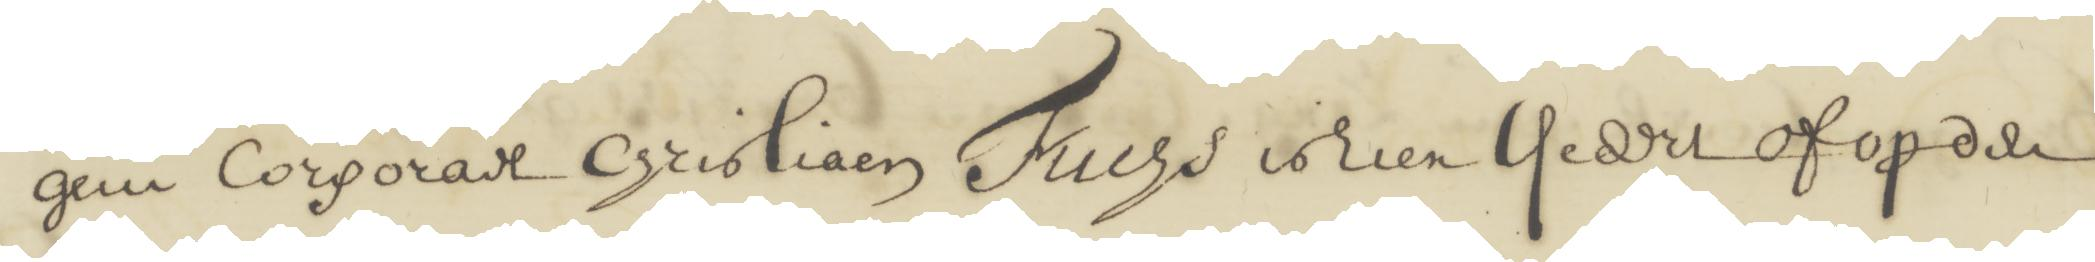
gem Corporael Christiaen Fuchs is hier tsedert of op den
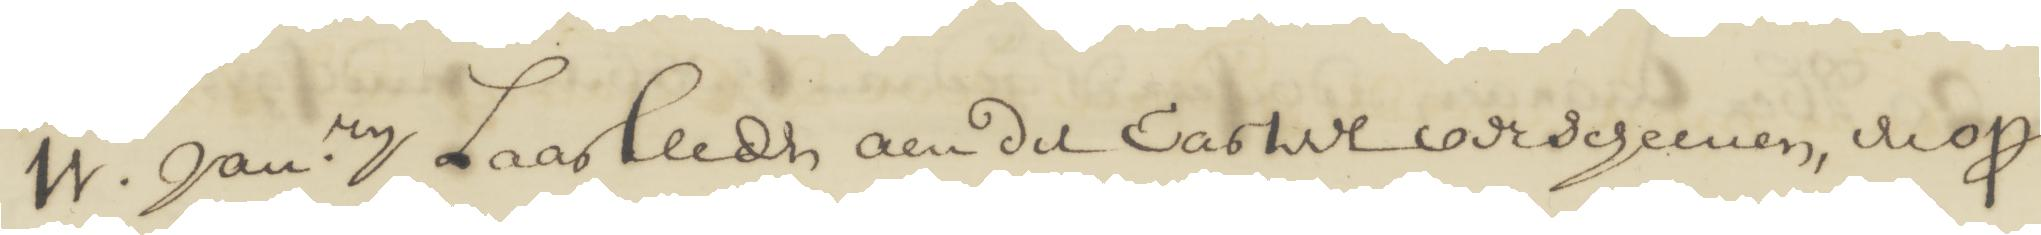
11.en Jan.ry Laastleden aen dit Casteel verscheenen, en op
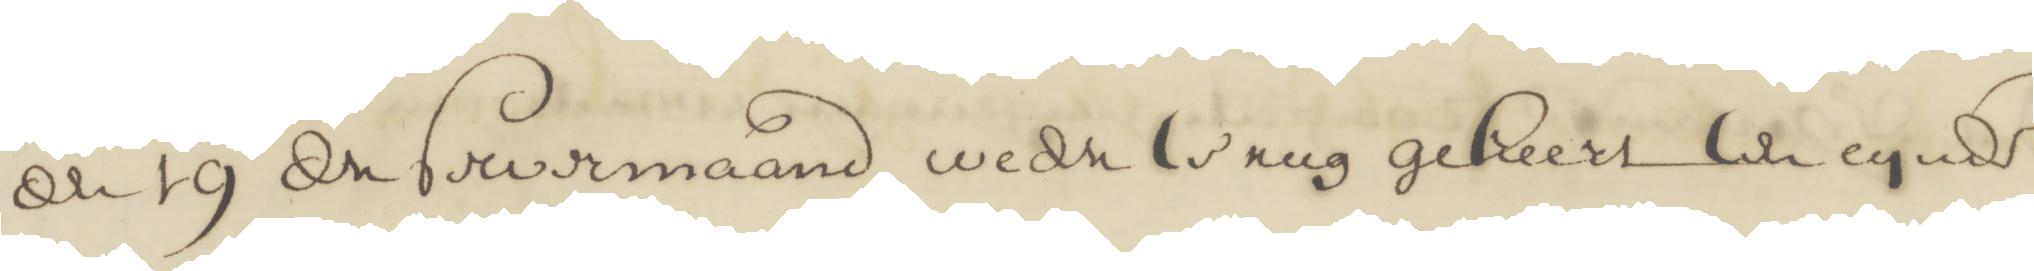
den 19 der selvermaand weder te rug gekeert ten eynde
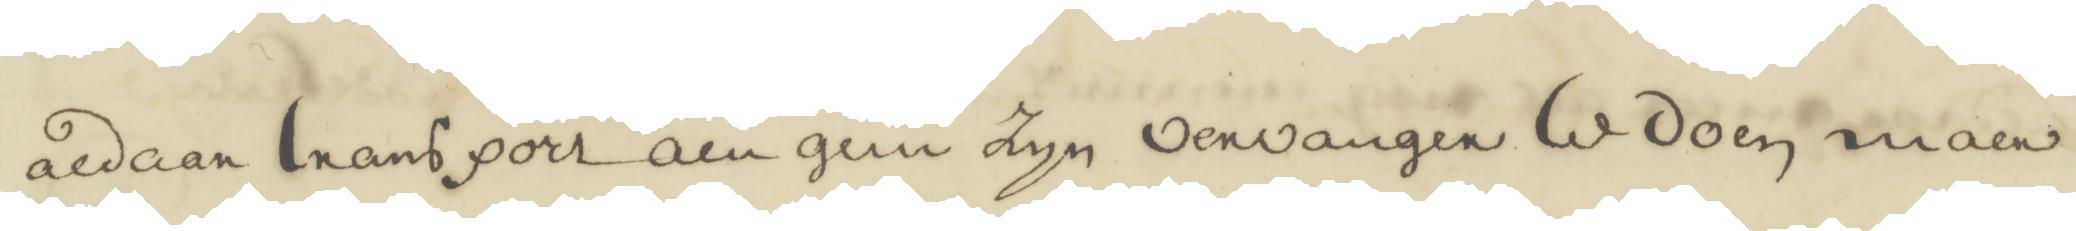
aldaar transport aen gem zyn vervanger te doen maer
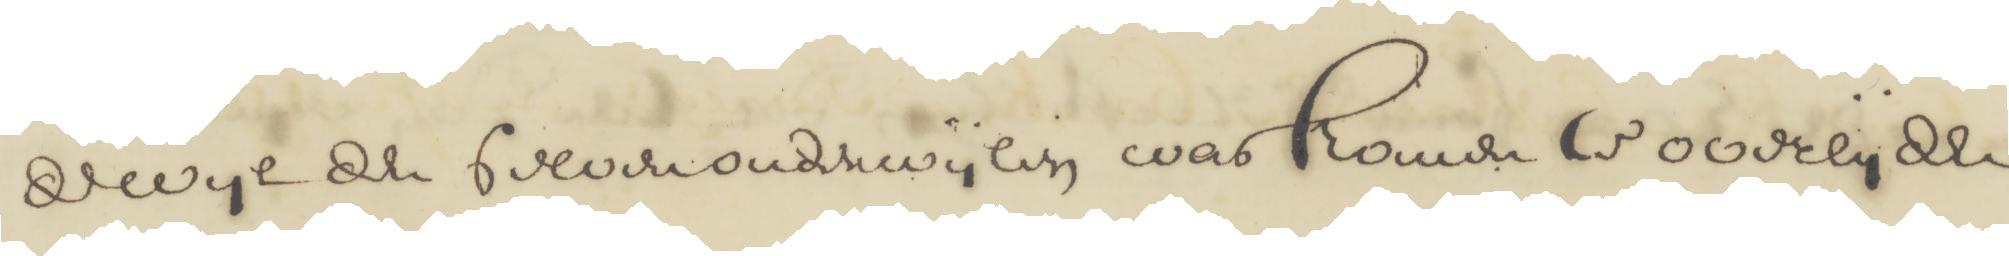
dewyl den selven onder wijlen was komen te overlijden
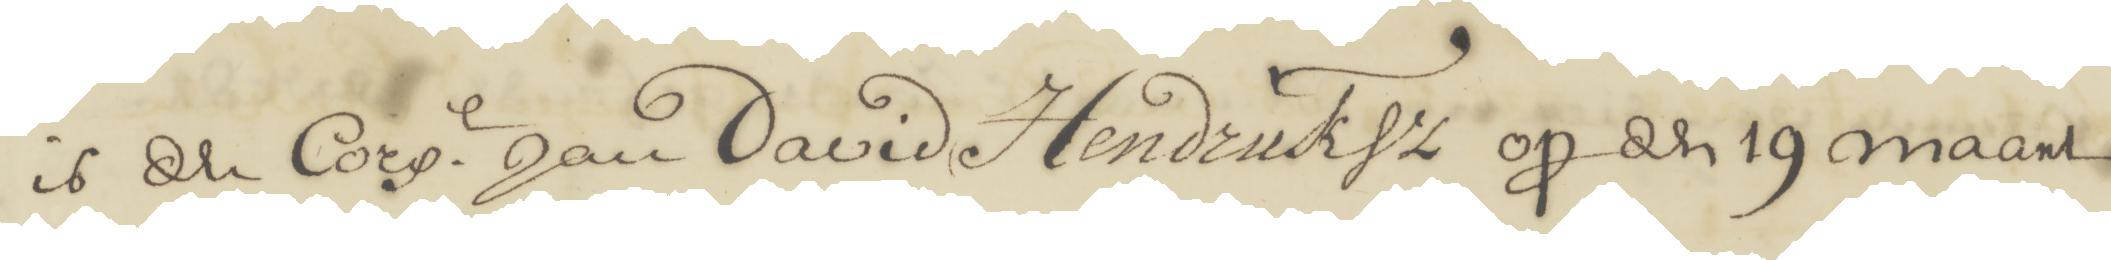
is den Corp:l Jan David Hendricksz op den 19 maart
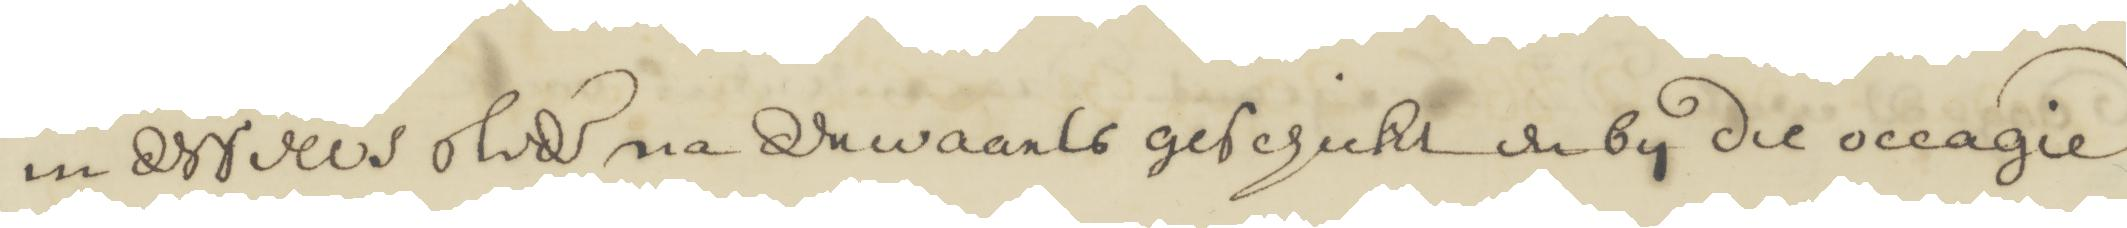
in desselvs stede na derwaarts geschickt en by die occagie
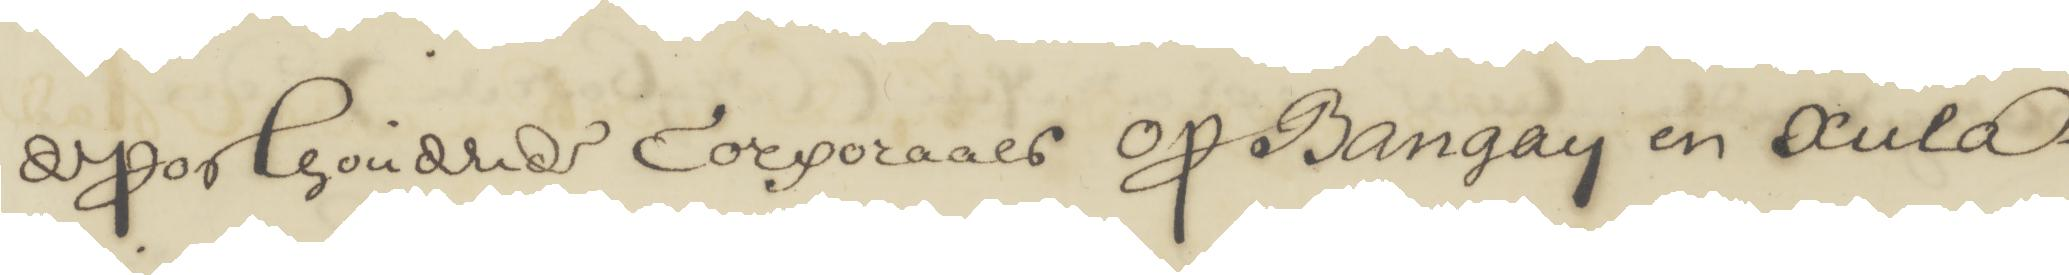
de posthoudende Corporaals op Bangay en xula
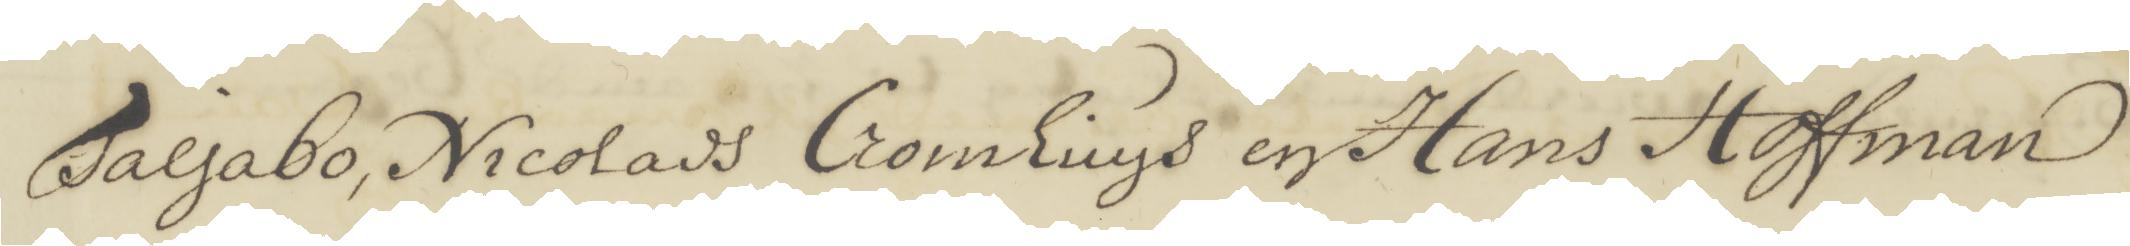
Taljabo, Nicolaes Cromhuijs en Hans Hoffman
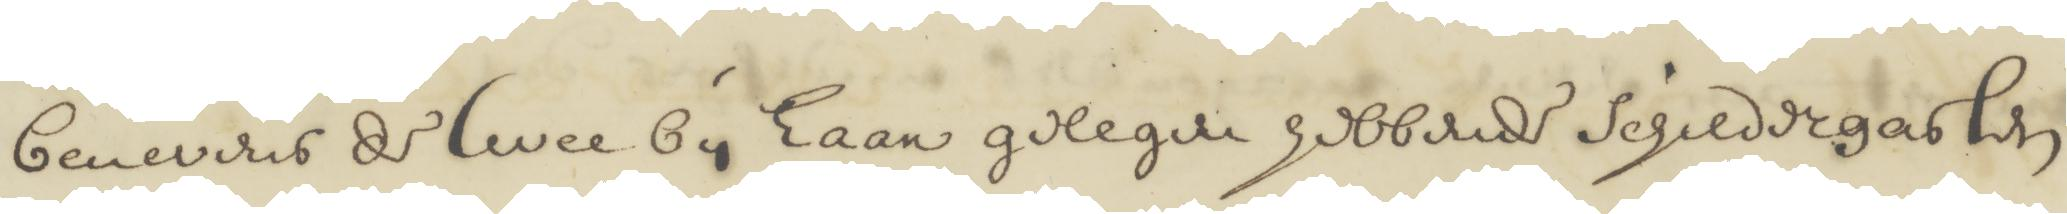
benevens de twee bij haar gelegen hebbende schildergasten
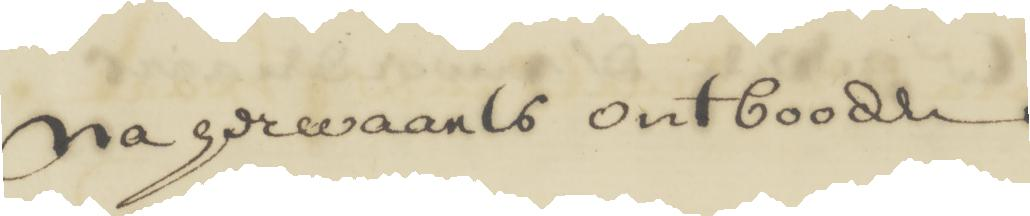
na derwaarts ontbooden
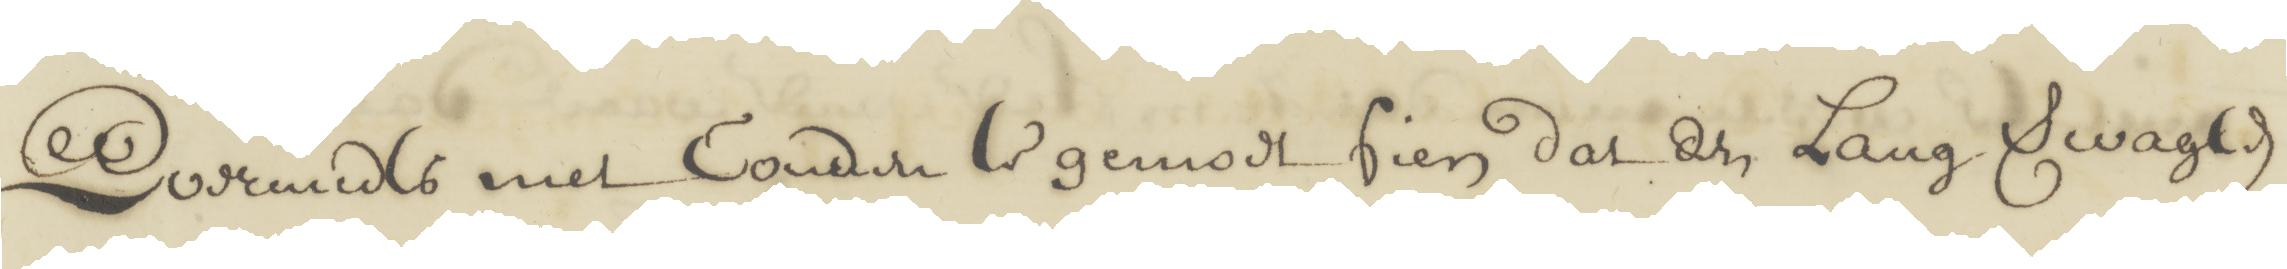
En vermidts niet Conden te gemoet sien dat den Lang verwagten
